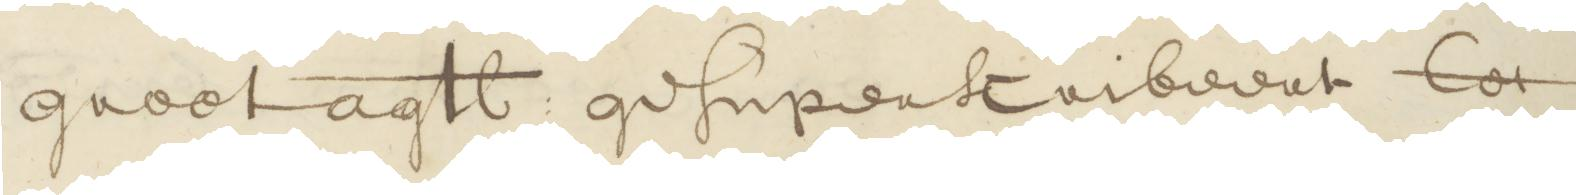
groot agtb: gesuperscribeert tot
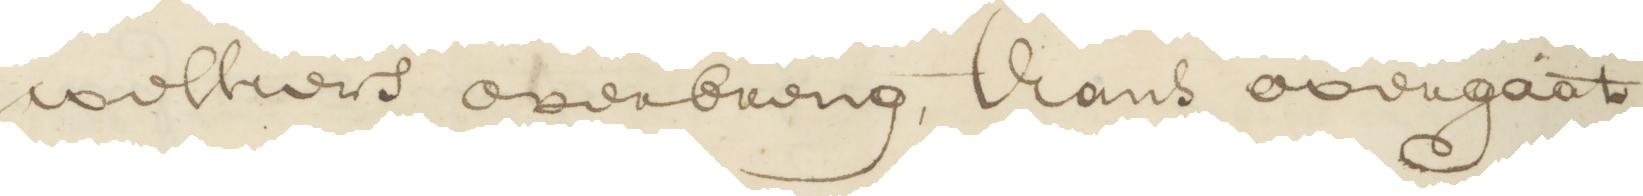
welkers overbreng, thans overgaat
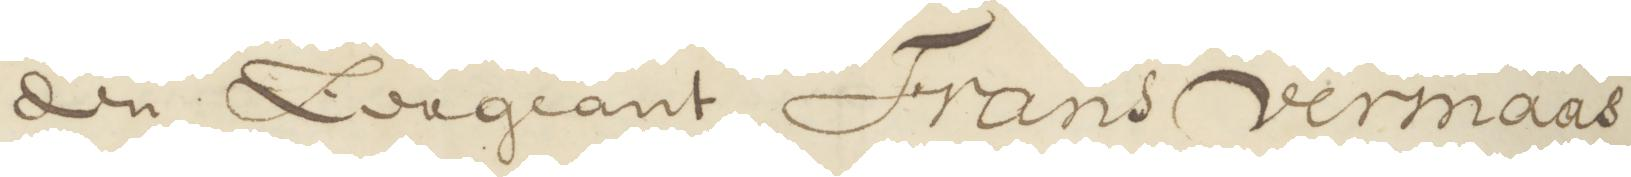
den Sergeant Frans vermaas
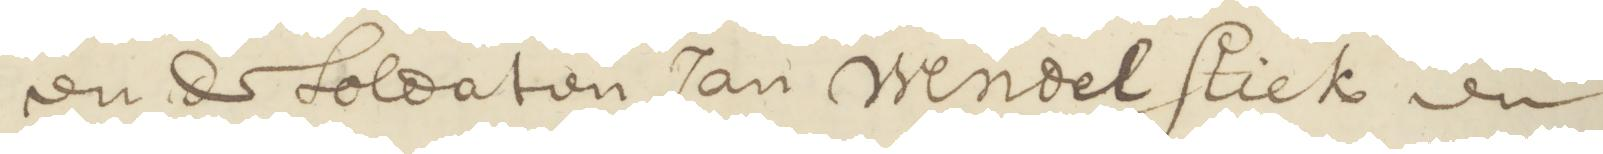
en de soldaten Jan Wendel Stiek en
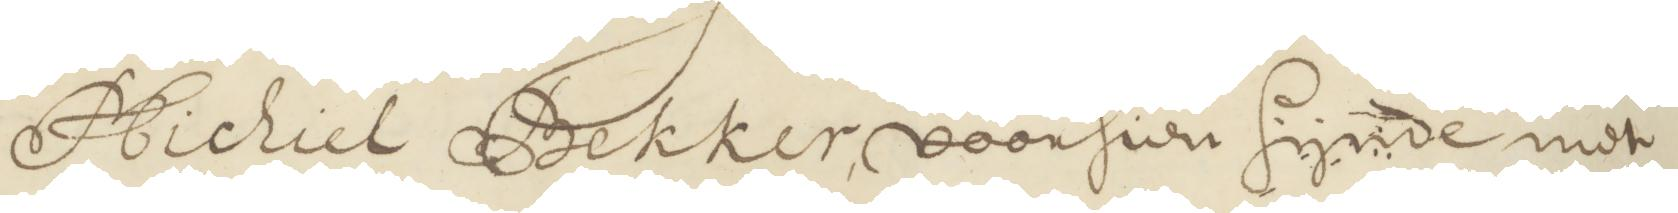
Michiel Bekker, voorsien sijnde met
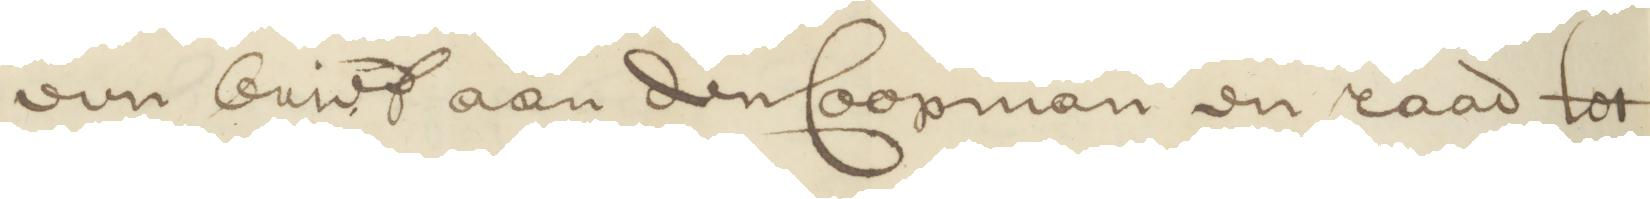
een brief aan den Coopman en raad tot
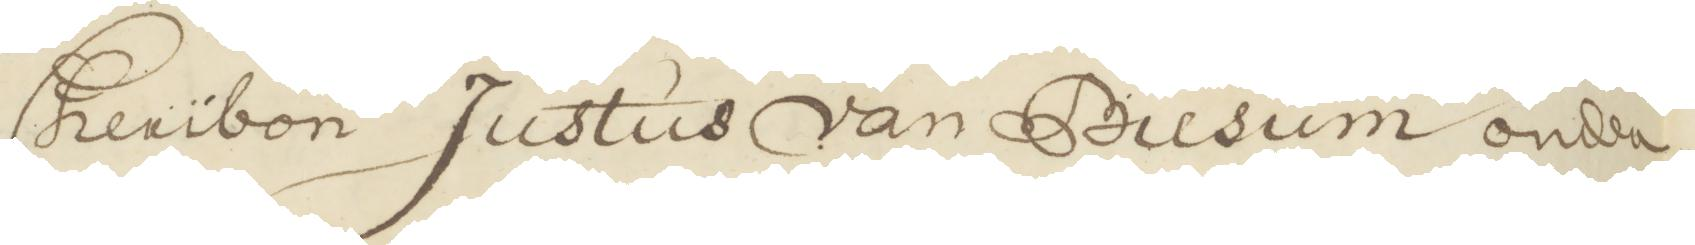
Cheribon Justus van Biesum onder
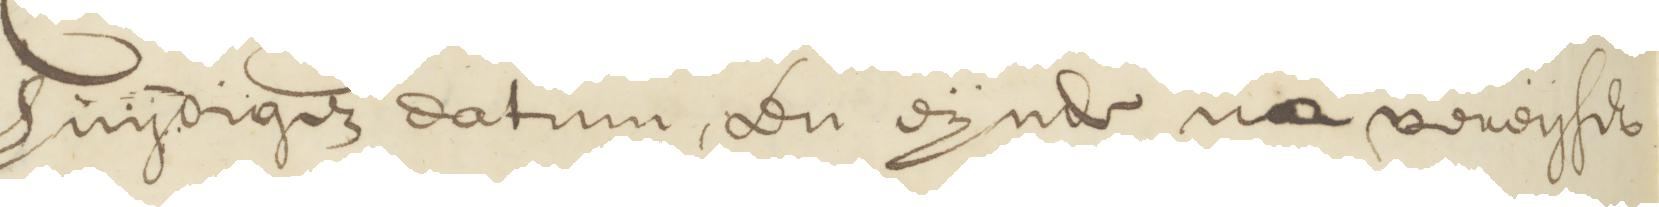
huijdigen datum, ten eijnde na vereijsen
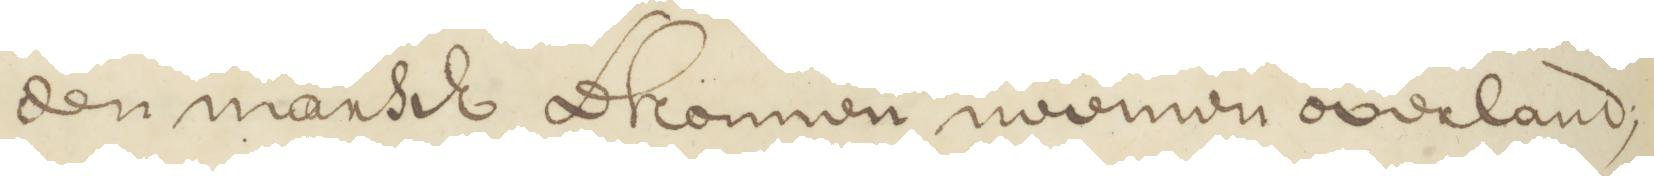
den marsch tekonnen neemen overland;
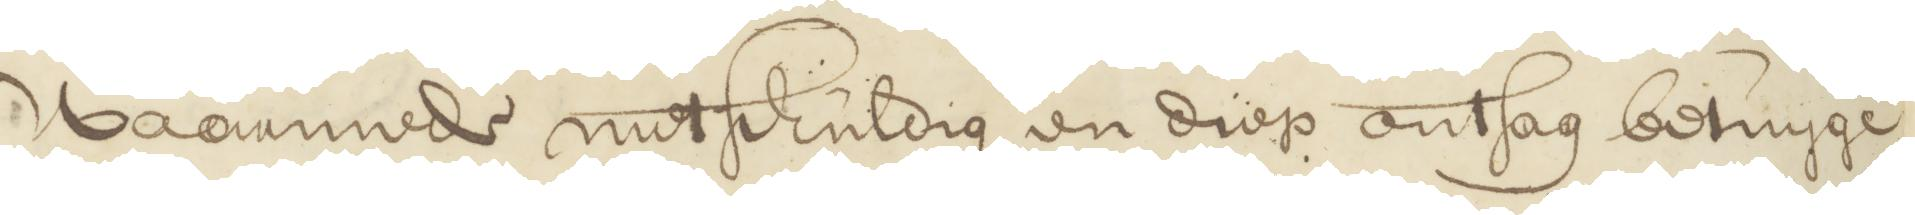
waarmede met schuldig en diep ontsag betuyge
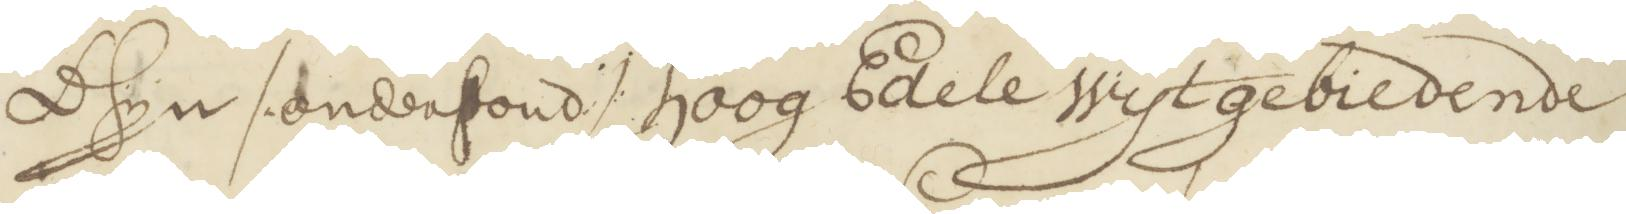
te syn /:onderhoud:/ Hoog Edele wijt gebiedende
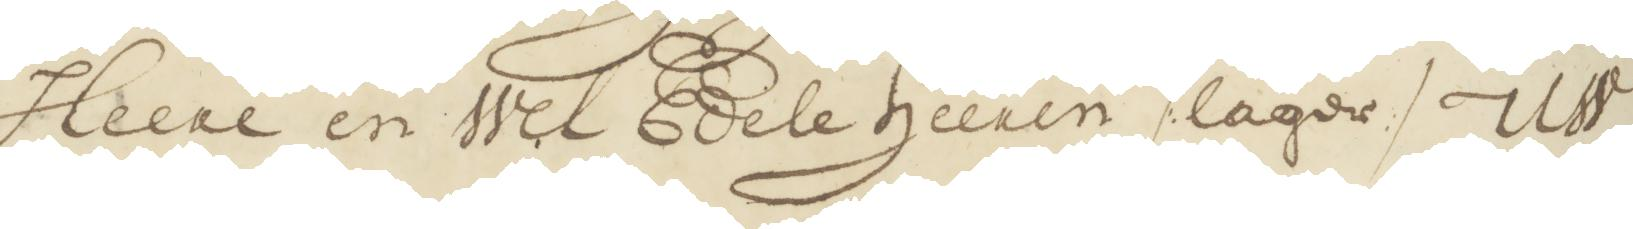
Heere en wel Edele heeren /:lager:/ uw
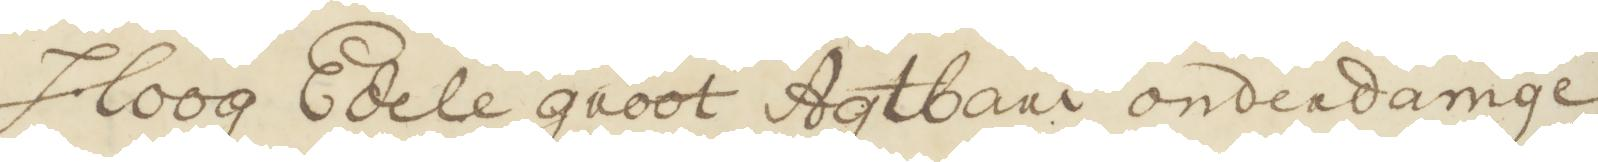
Hoog Edele groot Agtbare onderdanige
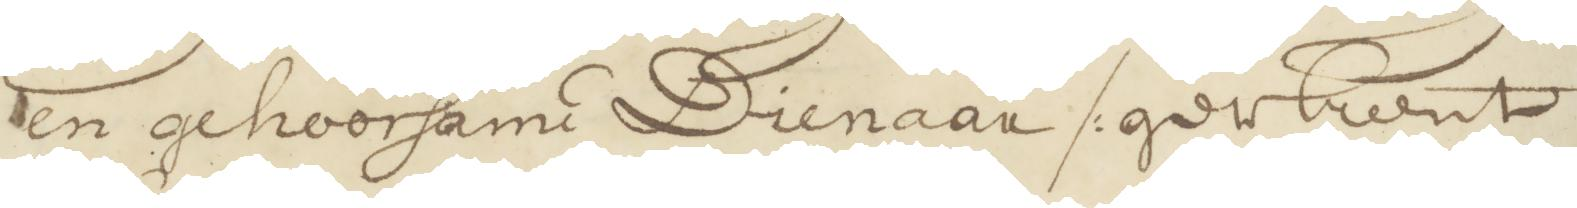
en gehoorsame Dienaar /:getekent:/
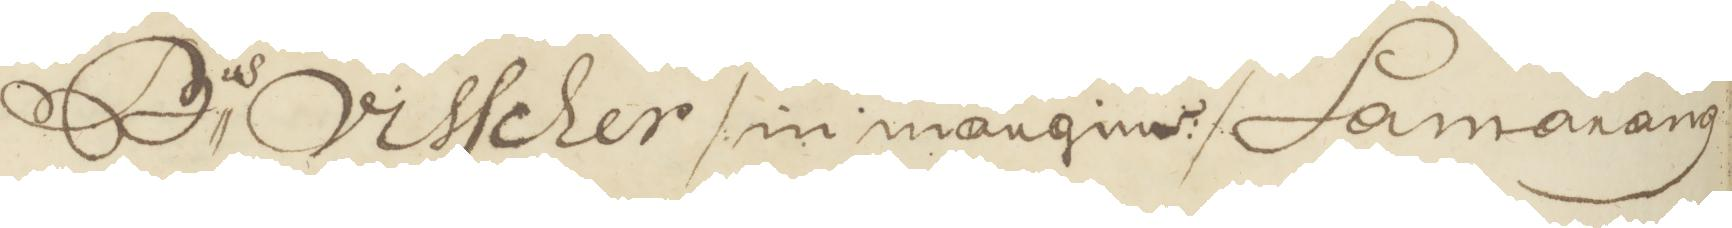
B„us Visscher /:in margine:/ Samarang
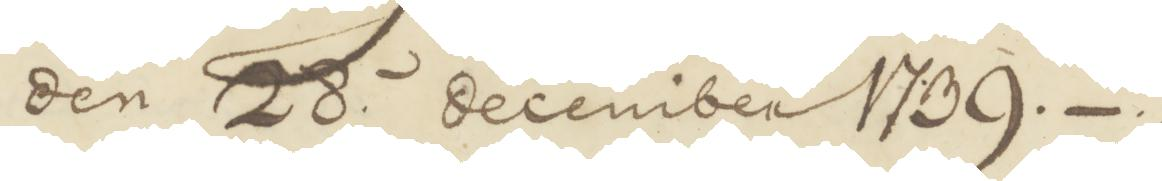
den 28:en Decemiber 1739.-
